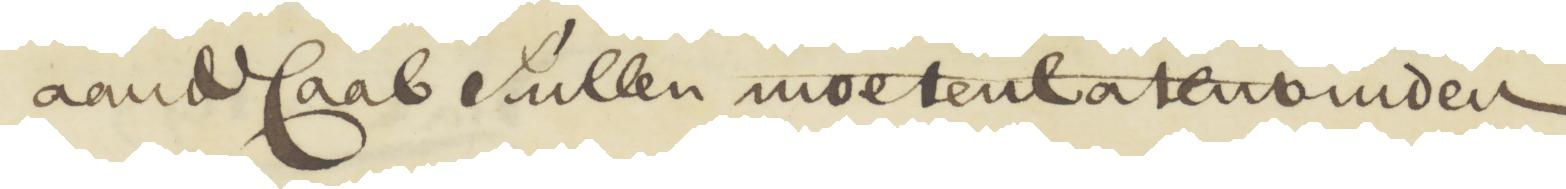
aan de Caab sullen moeten laten vinden
